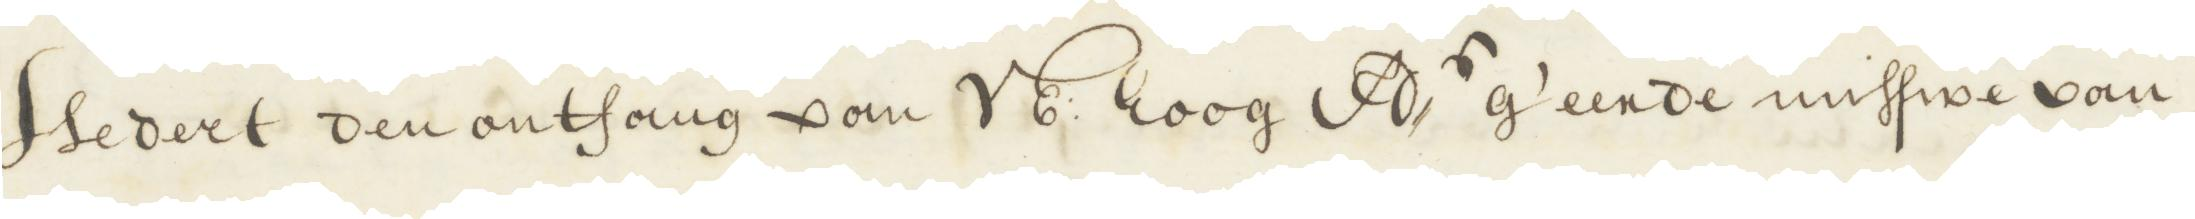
'tsedert den ontfang van UE: hoog Ed„s g’eerde missive van
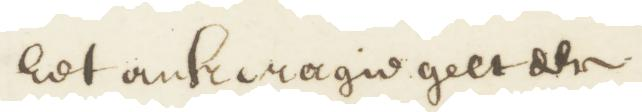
het ankeragie gelt der
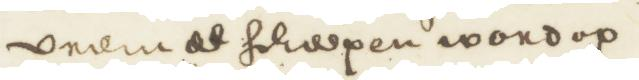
vremde scheepen word op
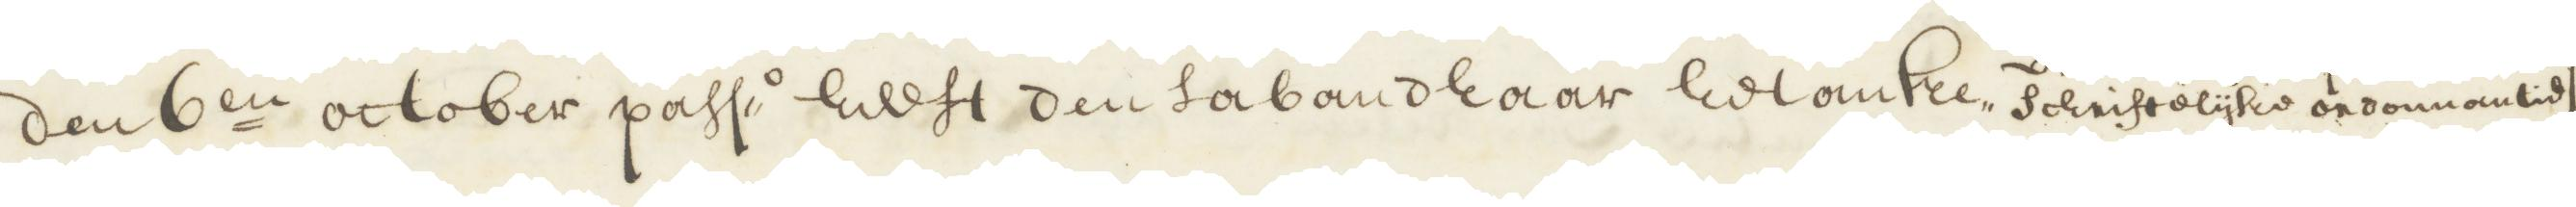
den 6=en october pass„o heeft den sabandhaar het anke„ schriftelijke ordonnantie
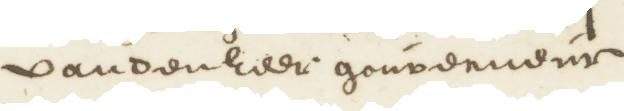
van den heer gouverneur
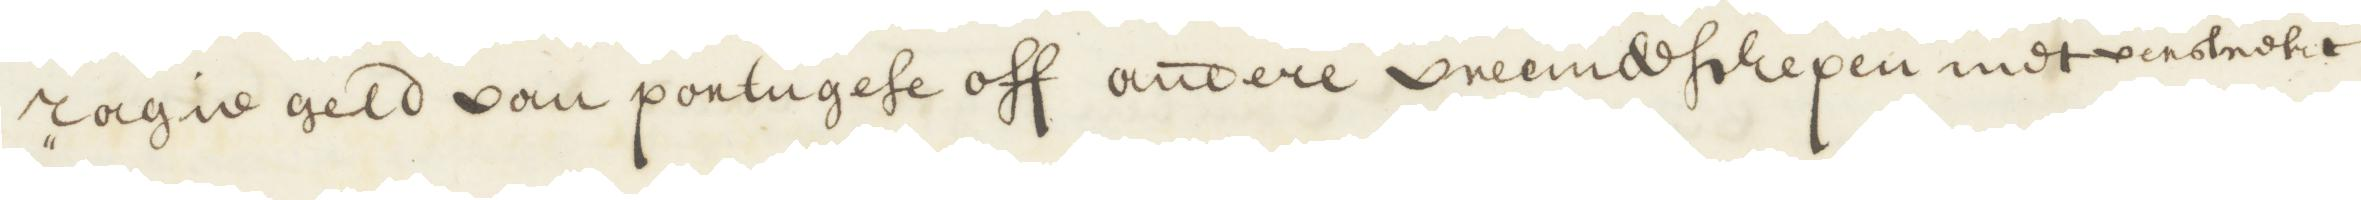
„ragie geld van portugese off andere vreemde schepen niet verstrekt
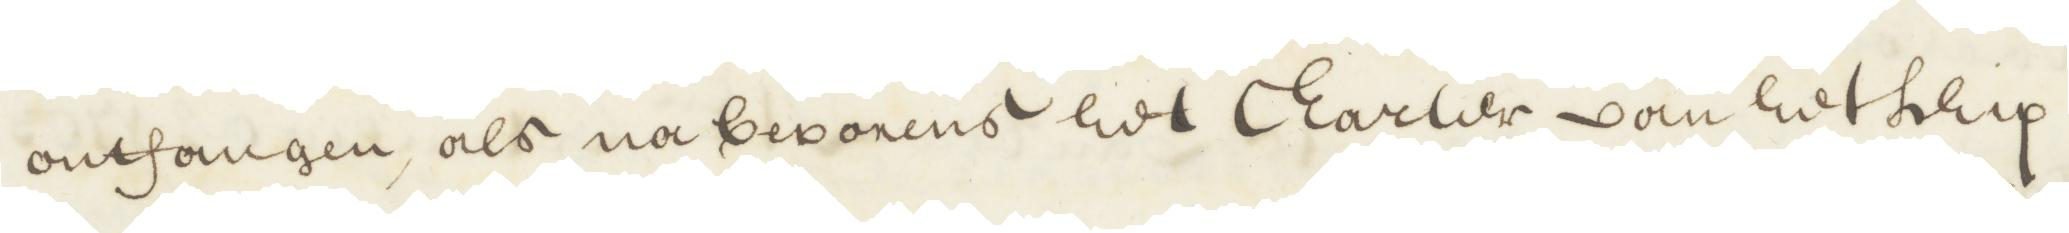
ontfangen, als na bevorens het Charter van het schip
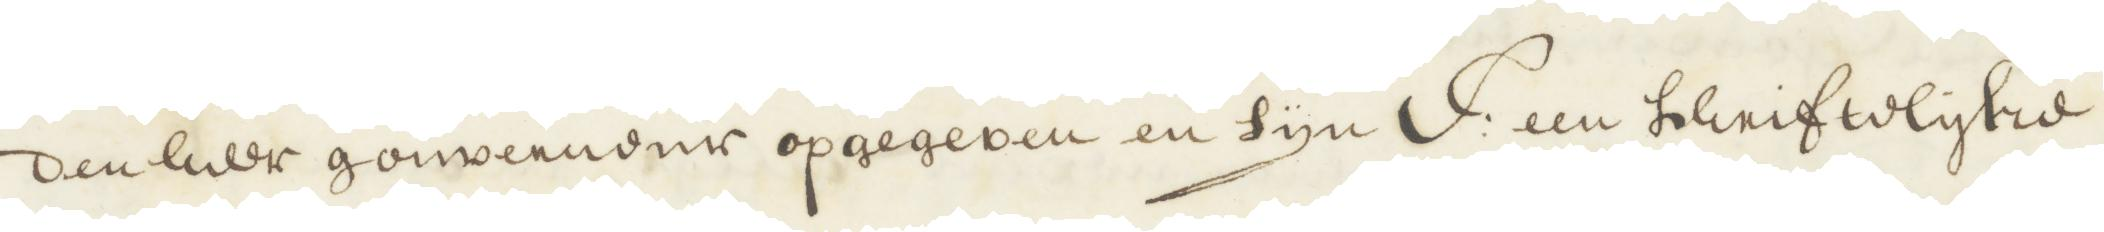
den heer gouverneur opgegeven en sijn E: een schriftelijke
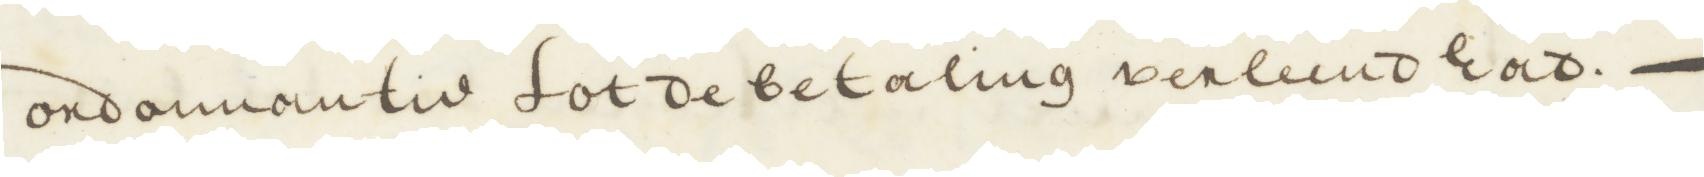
ordonnantie tot de betaling verleend had.
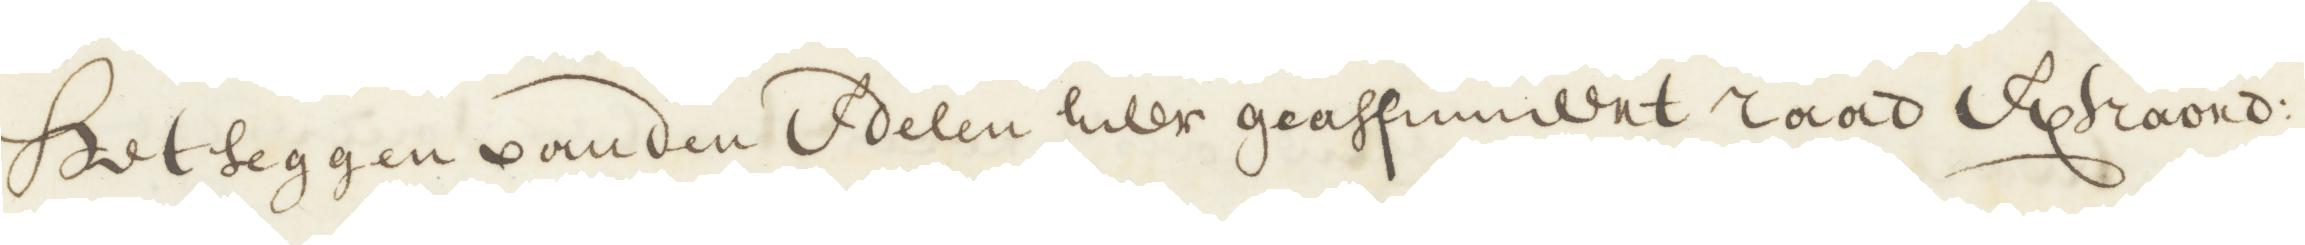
Het seggen van den Edelen heer geaffumeert raad Extraord:
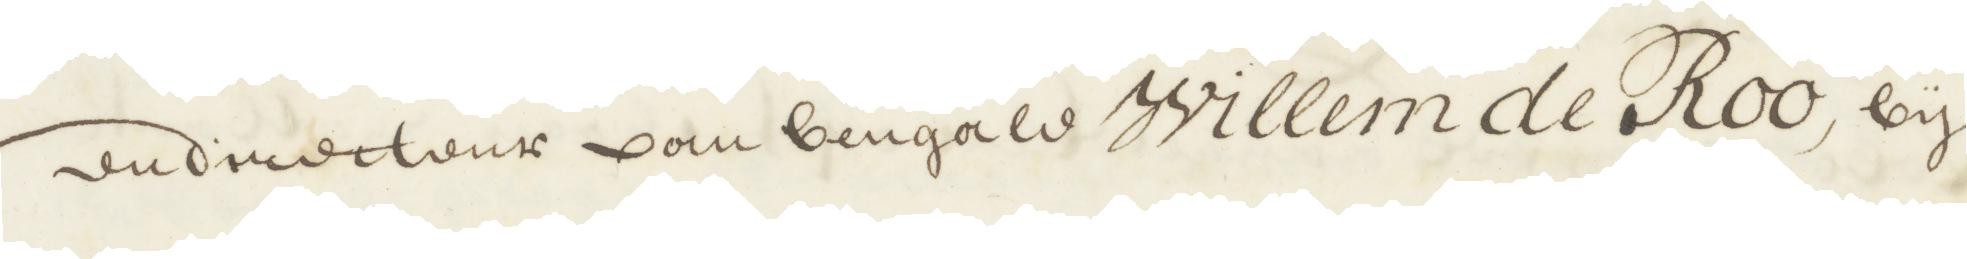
en directeur van bengale Willem de Roo, bij
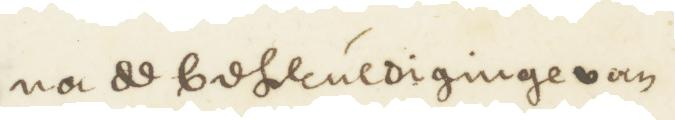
na de beschuldiginge van
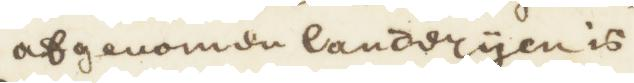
afgenomen landerijen is
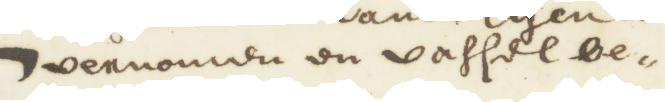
vernomen en vassel be„
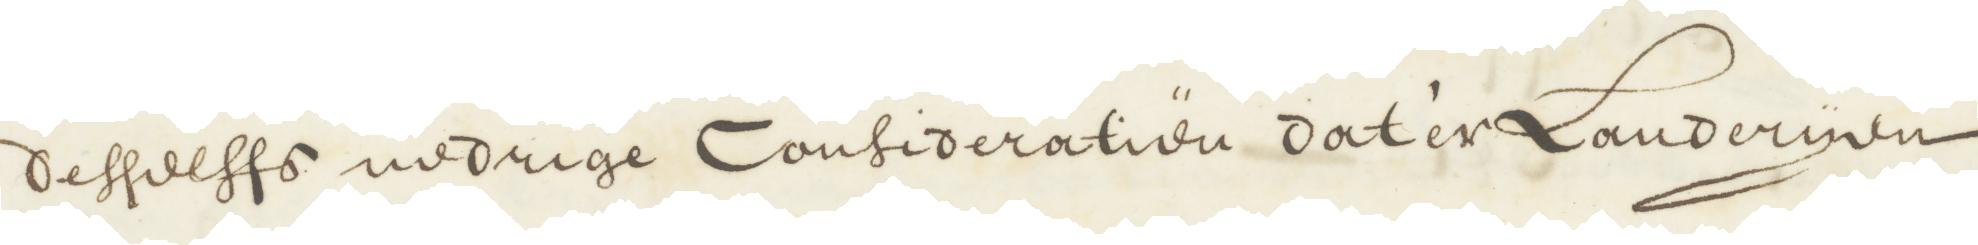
desselffs nedrige Consideratien dat er Landerijen
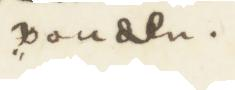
„vonden.
